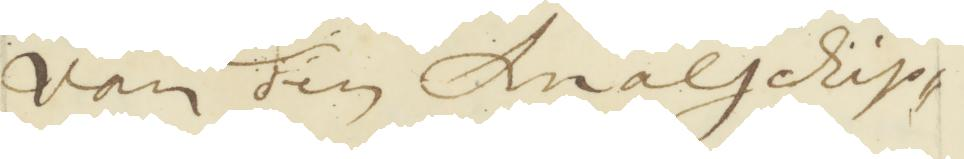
van den Smalschip„
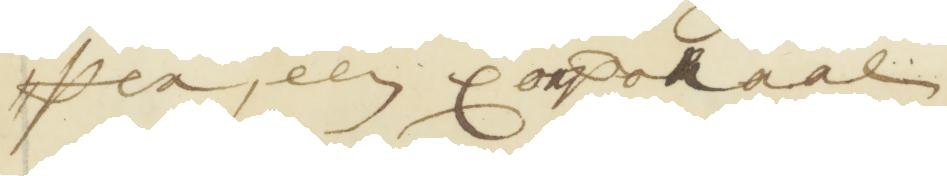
per, een Corporaal
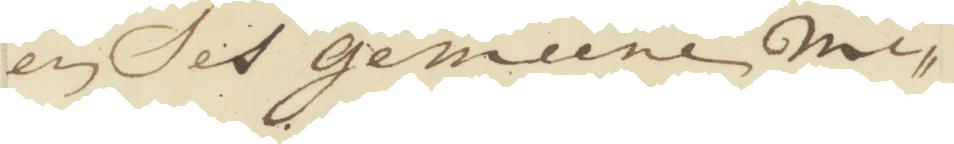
en ses gemeene mi„
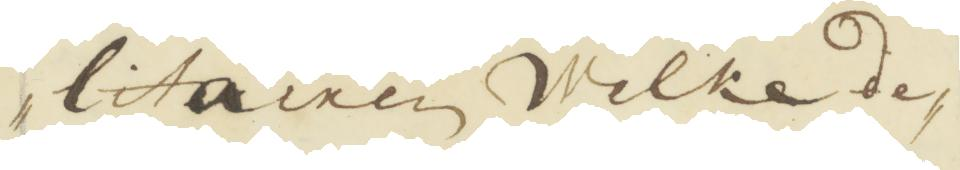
„litairen Welke de„
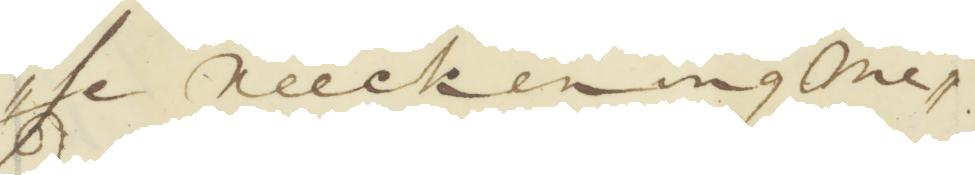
„se reeckening Me„
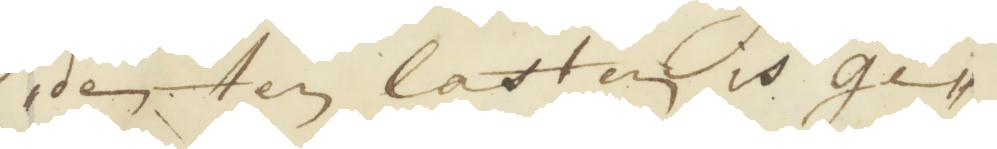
de ten lasten is ge„
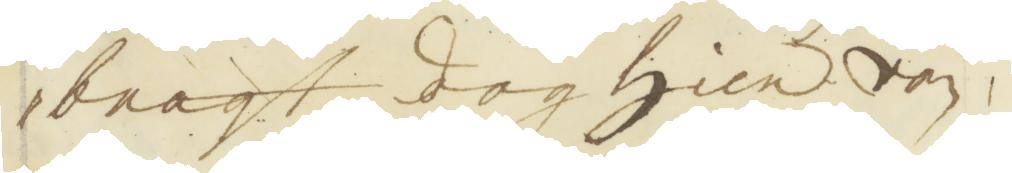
„bragt dog hier van,
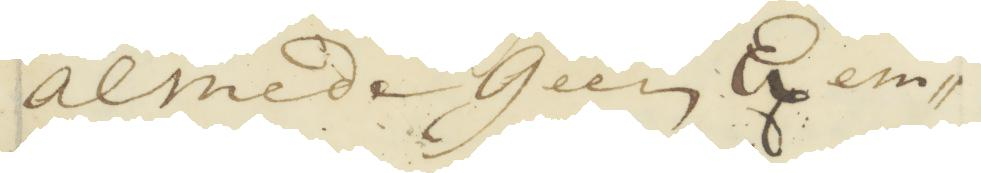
almede Geen Exem„
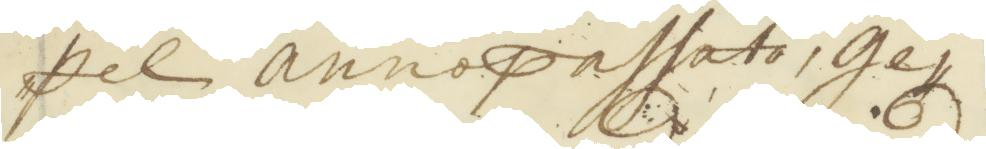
„Pel annopassato, Ge
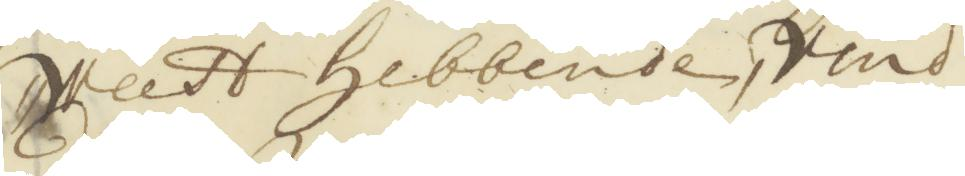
„Weest hebbende, Vind
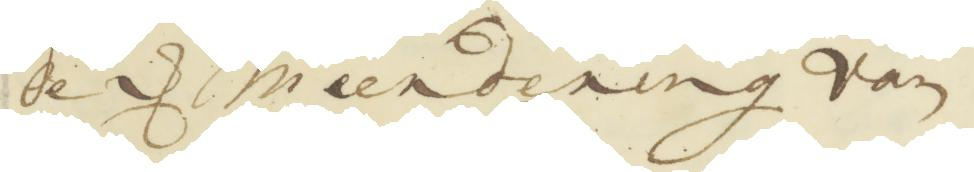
de ver Meerdering Van
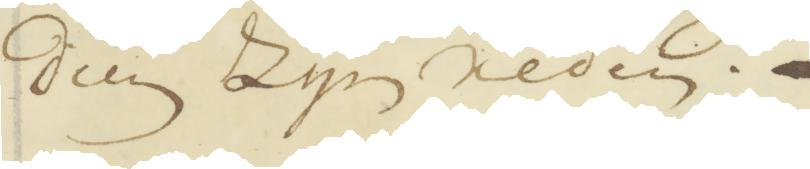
dien zijn reden. —
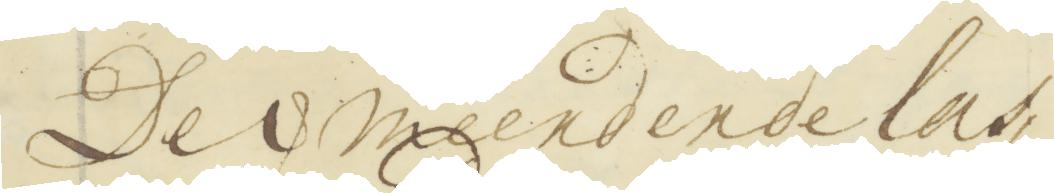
De ver Meerderde las„
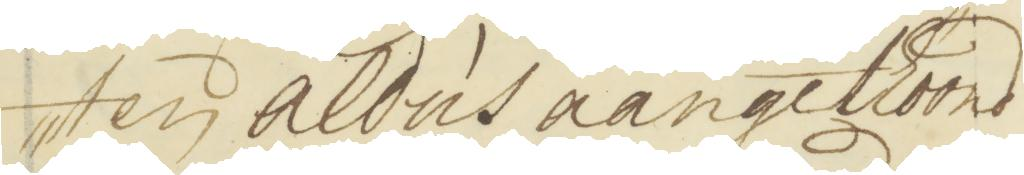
„ten aldus aangethoond
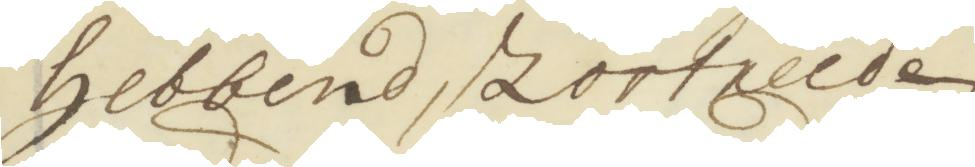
hebbend, zootreede
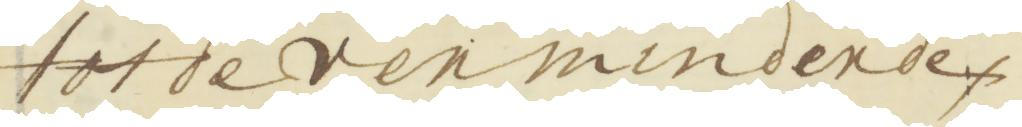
tot de verminderde,
